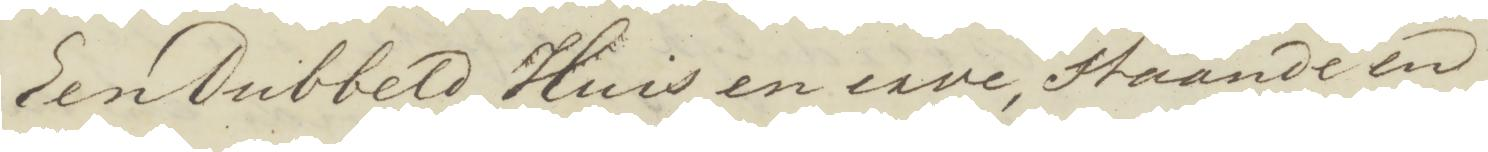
No 1. Een dubbeld Huis en erve, staande en
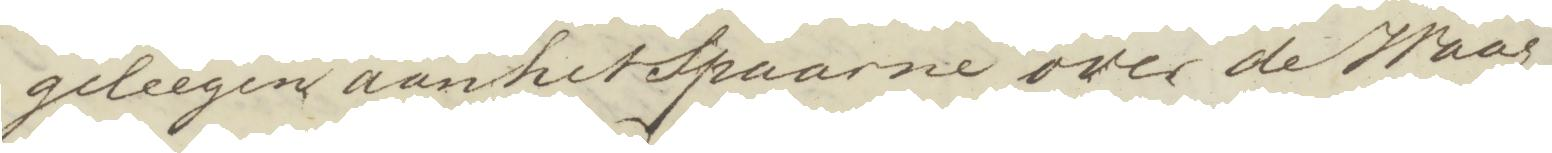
geleegen aan het Spaarne over de Waag
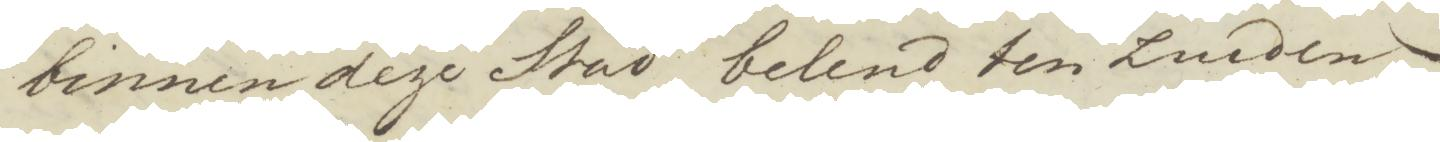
binnen deze Stad, belend ten zuiden
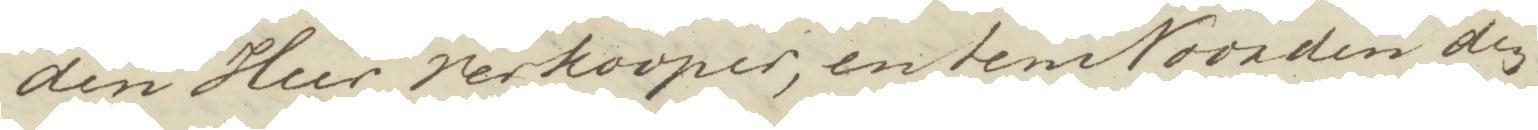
den Heer verkooper, en ten Noorden den
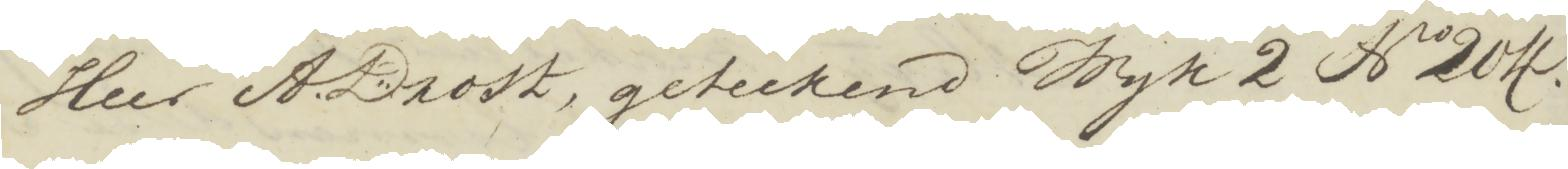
Heer A. Drost, geteekend Wyk 2 No 204.
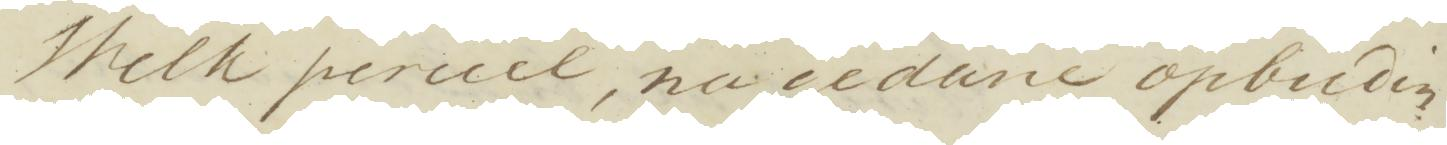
Welk perceel, na gedane opbiedin
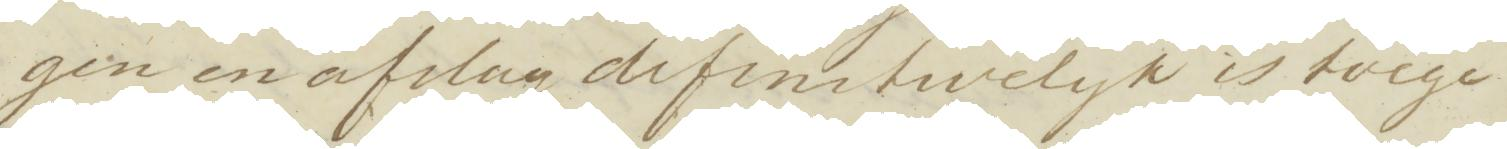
gen en afslag definitivelyk is toege
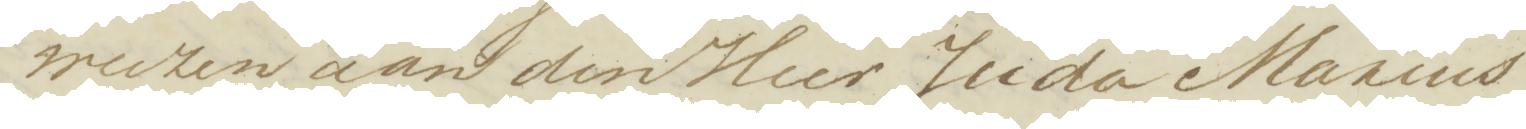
weezen aan den Heer Juda Marius
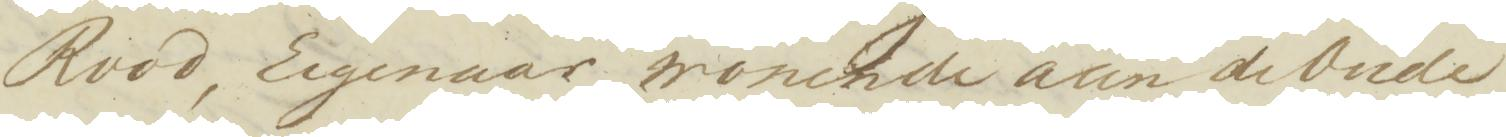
Rood, Eigenaar, wonende aan de oude
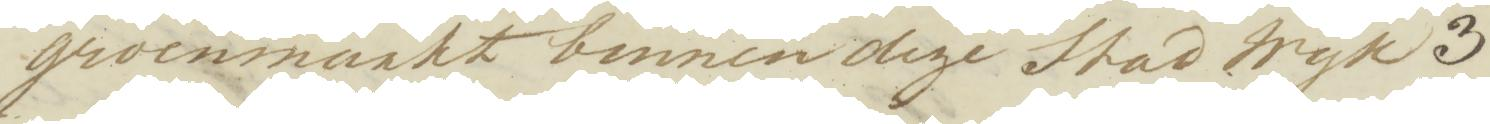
groenmarkt binnen deze stad wyk 3
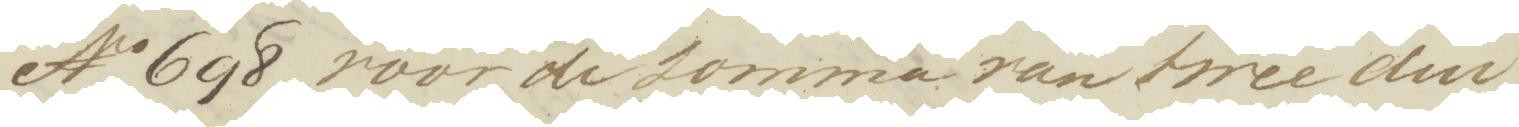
N.o 698, voor de somma van twee dui=
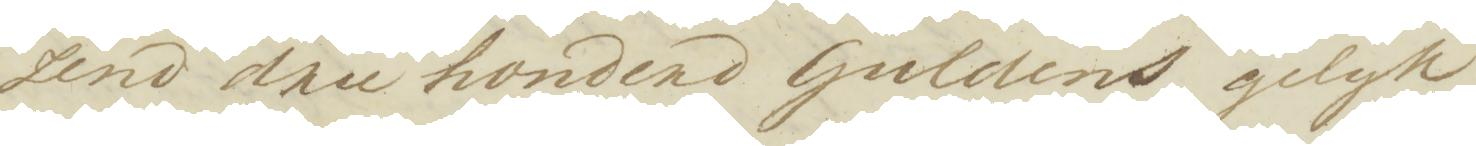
=zend drie honderd Guldens, gelyk
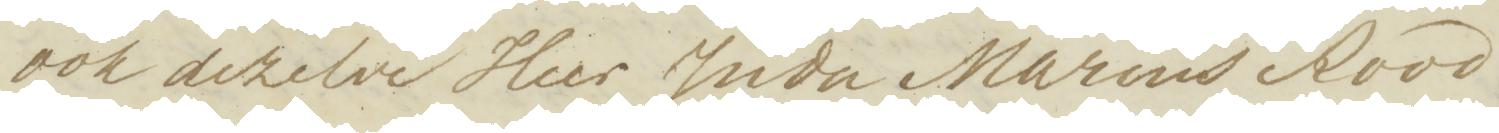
ook dezelve Heer Juda Marius Rood
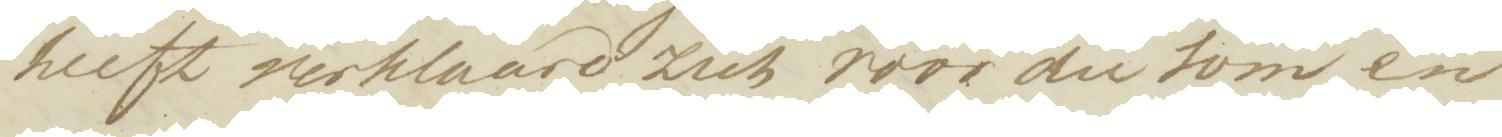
heeft verklaard zich voor die som, en
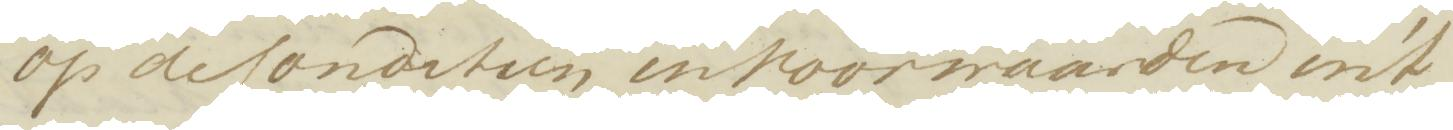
op de conditien en voorwaarden in’t
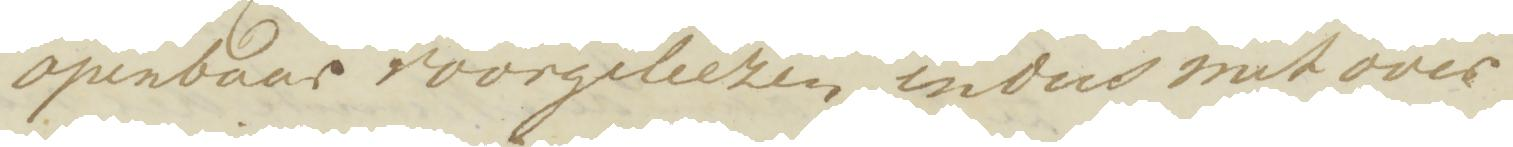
openbaar voorgeleezen, en dus met over
